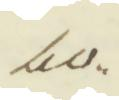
40„
